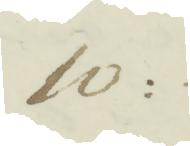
10 :
